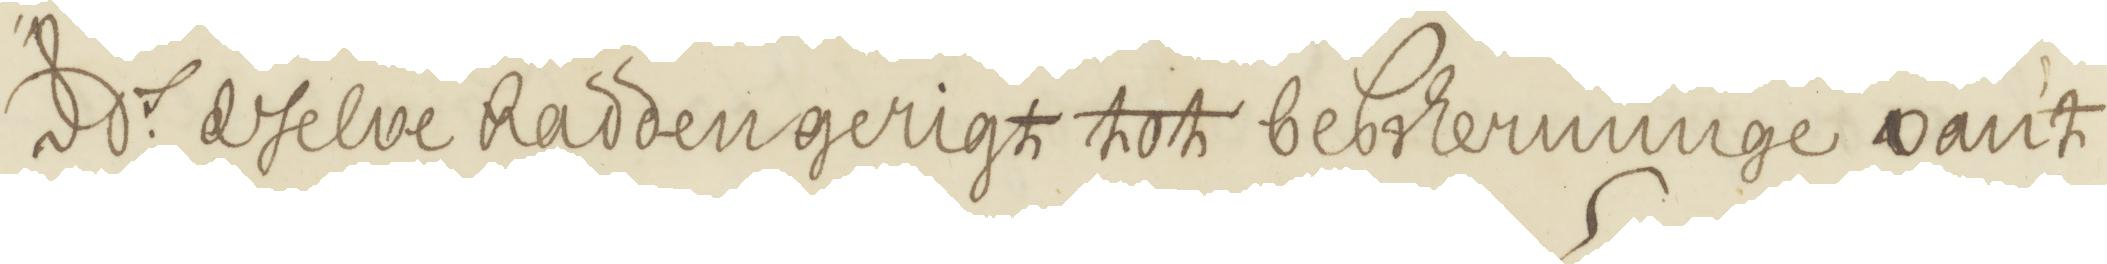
Ed:s deselve hadden gerigt tot bescherminge van’t
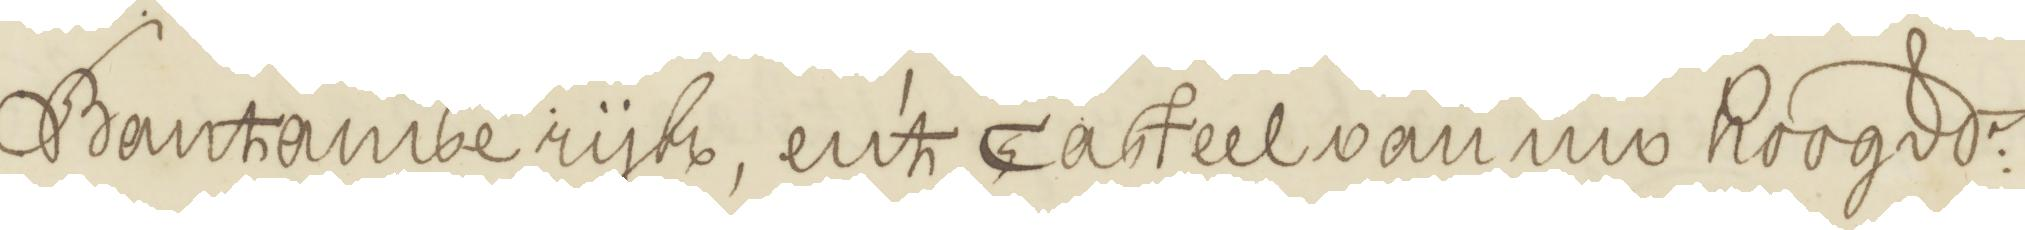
Bantamse rijk, en’t casteel van uw hoog Ed:
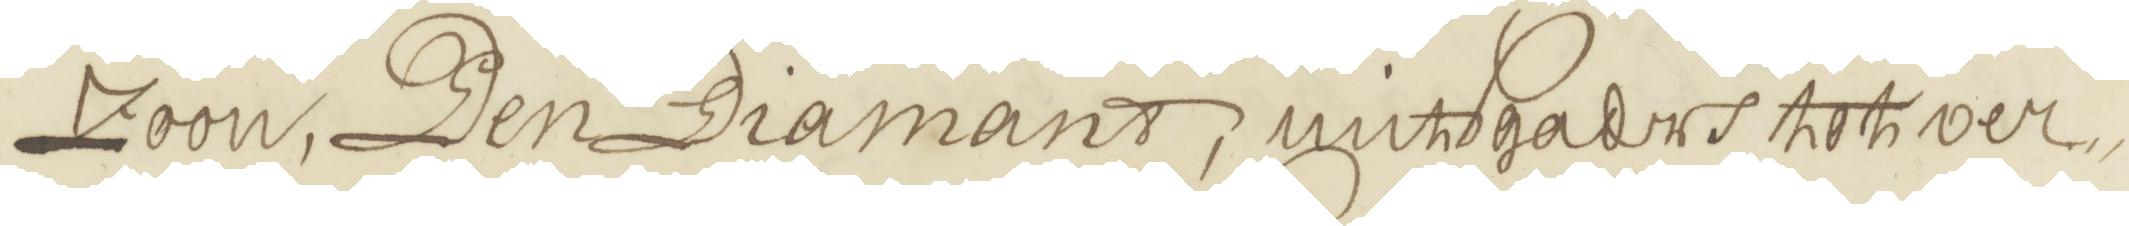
zoon, Den Diamant, mitsgaders tot ver„
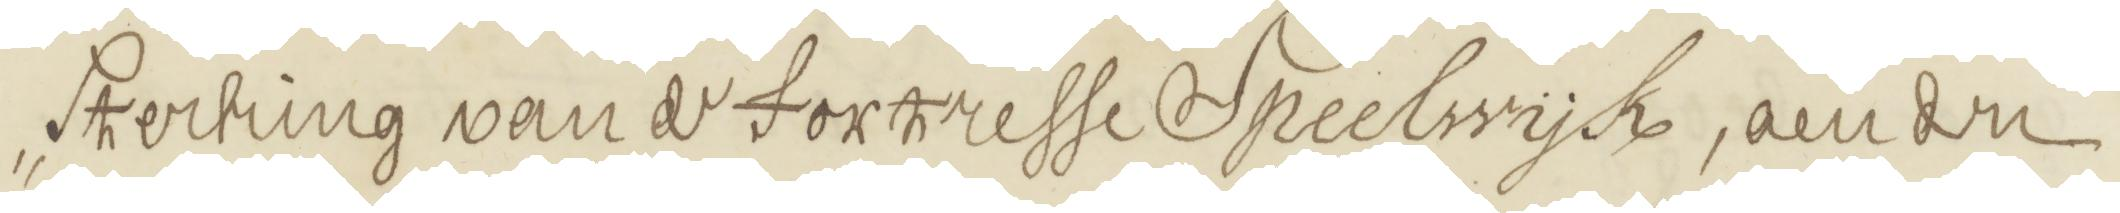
„sterking van de fortresse Speelwijk, aen den
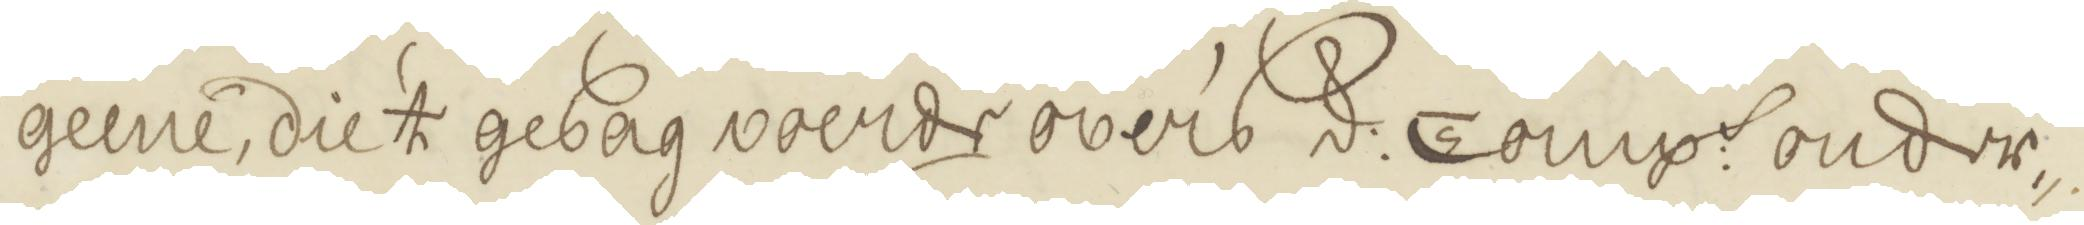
geene, die ’t gesag voerde over ’s E: comp:s onder„
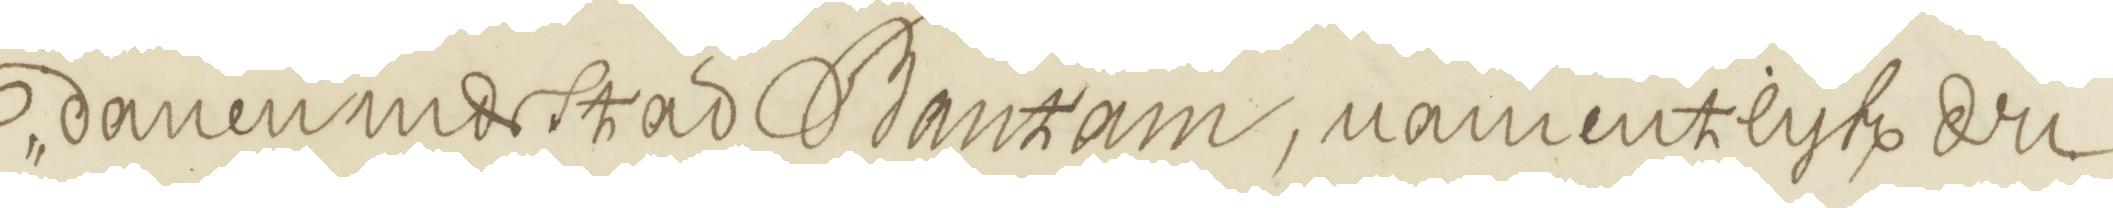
„danen inde stad Bantam, namentlijk den
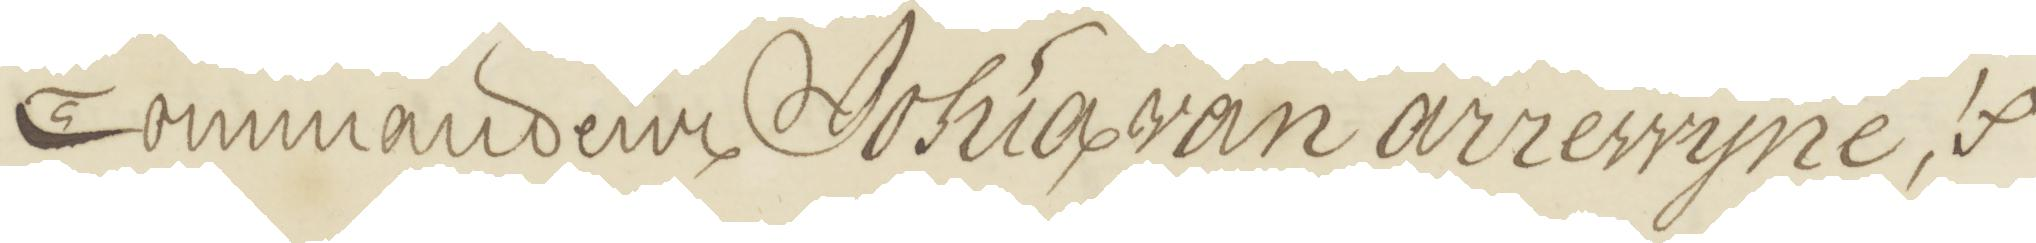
commandeur Josua van arrewijne, ’s
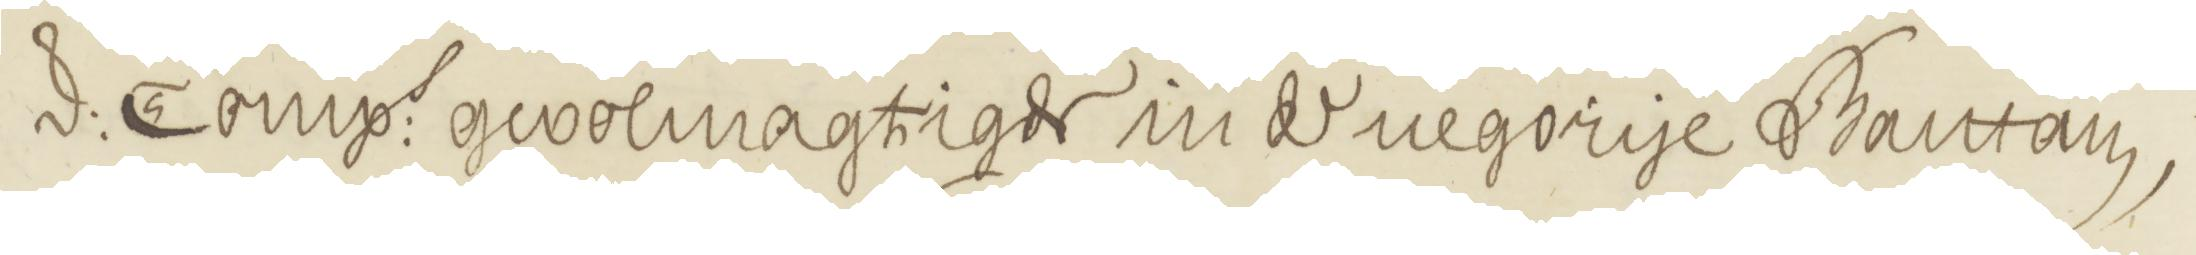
E: comp:s gevolmagtigde in de negorije Bantam,
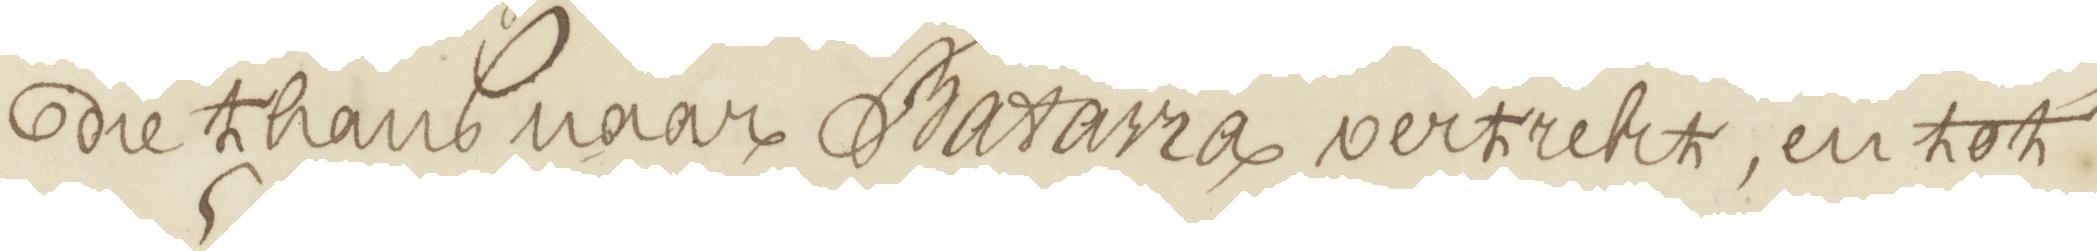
die thans naar Batavia vertrekt, en tot
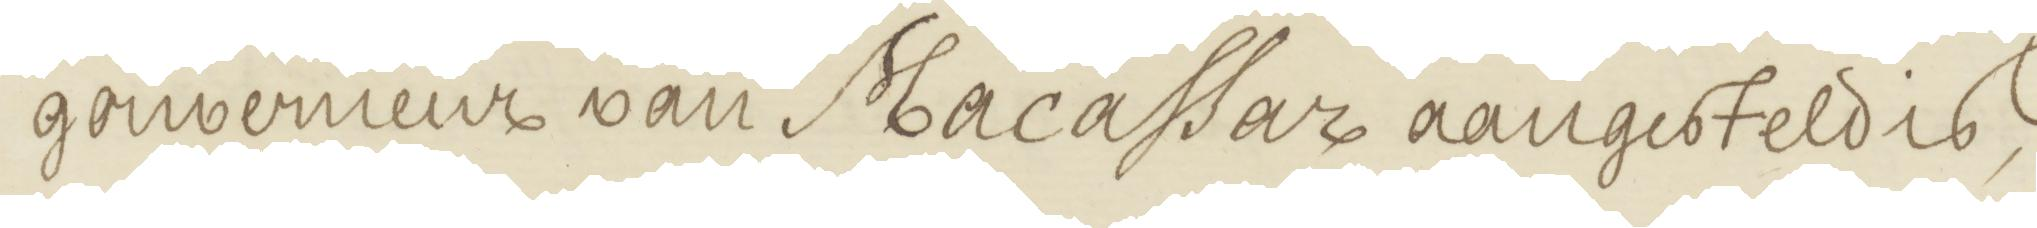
gouverneur van Macassar aangesteld is,
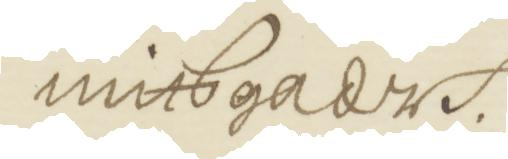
mitsgaders.
